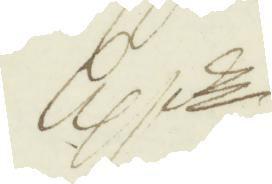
Exp=
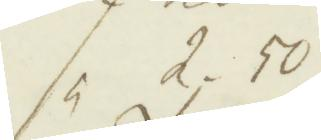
„ 2.50
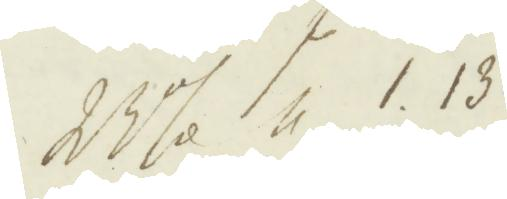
23% „ 1:13
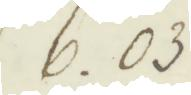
6.03
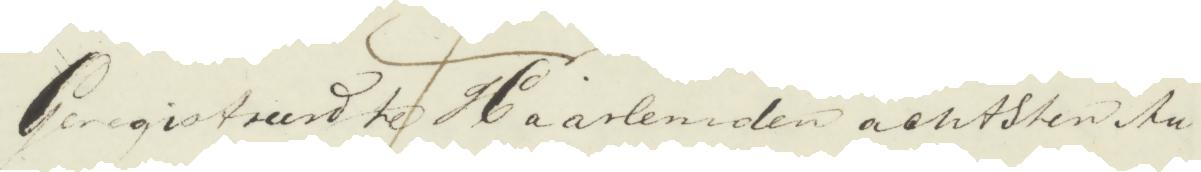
Geregistreerd te Haarlem den achtsten Au
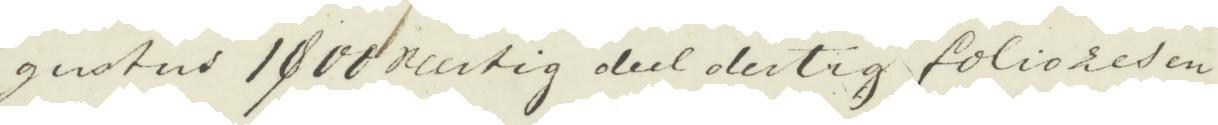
gustus 1800 veertig deel dertig folio zes en
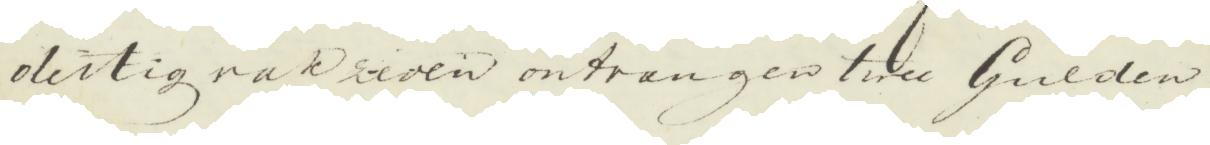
dertig vak zeven ontvangen twee Gulden
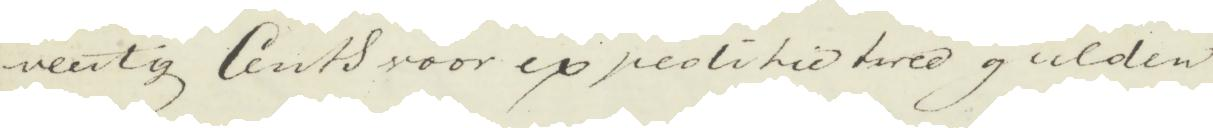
veertig Cents voor expedititie twee gulden
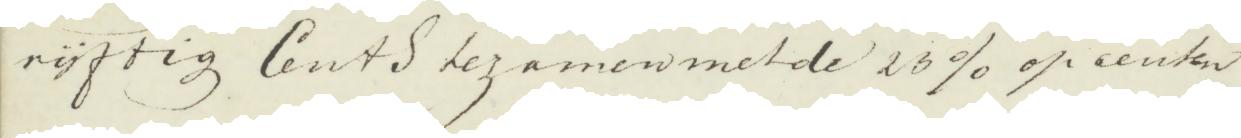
vijftig Cents tezamen met de 23% opcenten
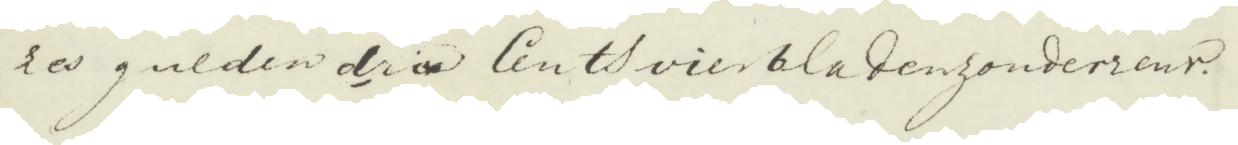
zes gulden drie Cents vier bladen zonder renv.
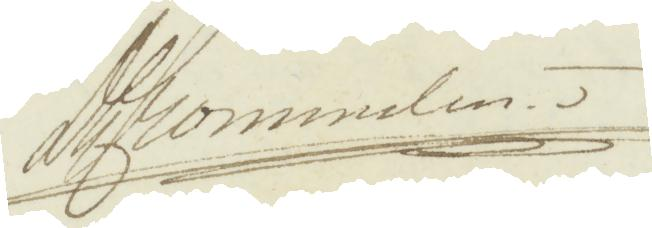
DFCrommelin .)
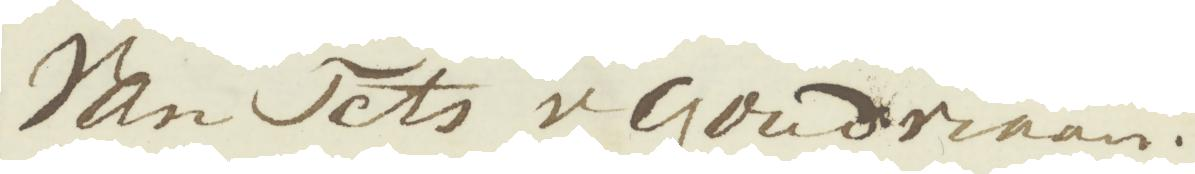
Van Tets v Goudriaan.
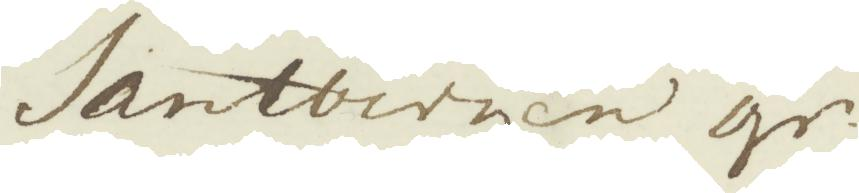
Santbergen jr
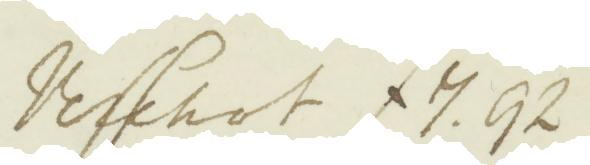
Verschot ƒ 7.92
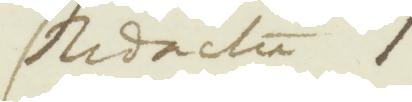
Redactie 1
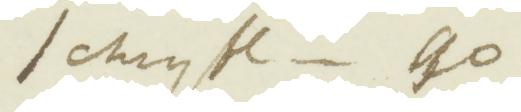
schrijfl — 90
